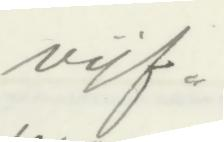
vijf„
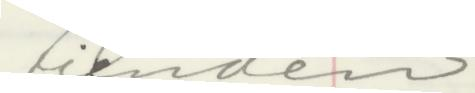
tienden
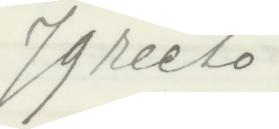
79 recto
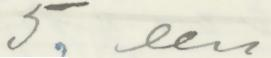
5, een
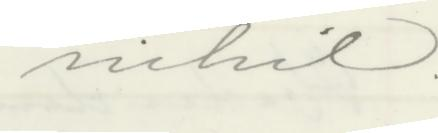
nihil
